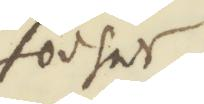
soesas
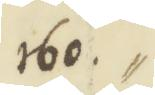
160. „
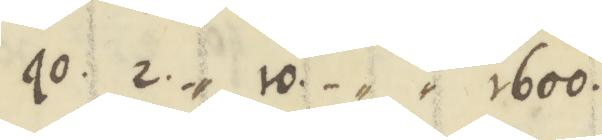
40. 2. „ 10. – „ „ 1600
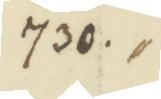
730. „
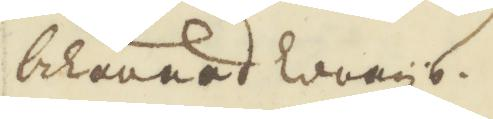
kharrad hevrijs.
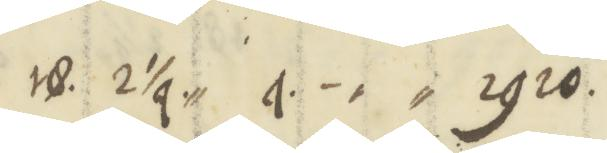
18. 2¼.„ 4. – „ „ 2920
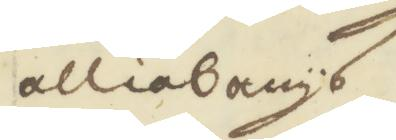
alliabanijs
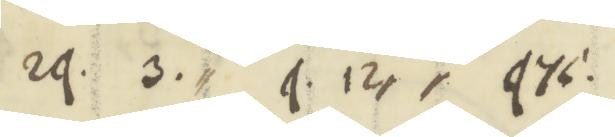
24. 3. „ 4. 12„ „ 475.
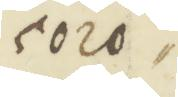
5020 „
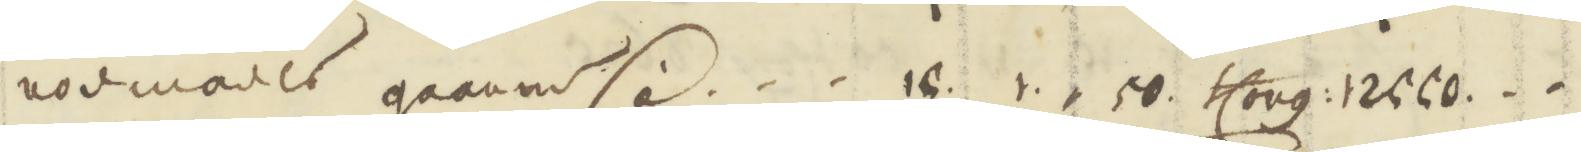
roemaels gaarne @ - – – 15. 1. „ 50. tcorg: 12550. - -
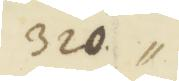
320. „
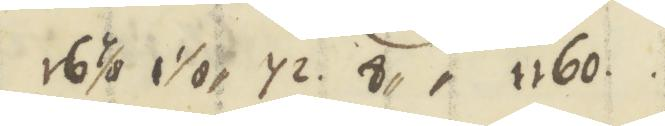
16 7/8 1 1/8„ 72. 8„ „ 1160.
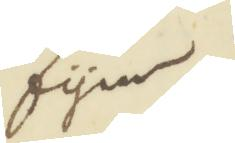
fijne .
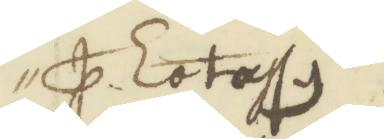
„ p. hotassen
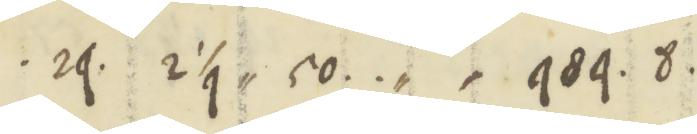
- 24. 2¼ „ 50. . „ „ 484. 8
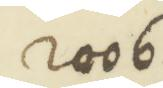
2006
